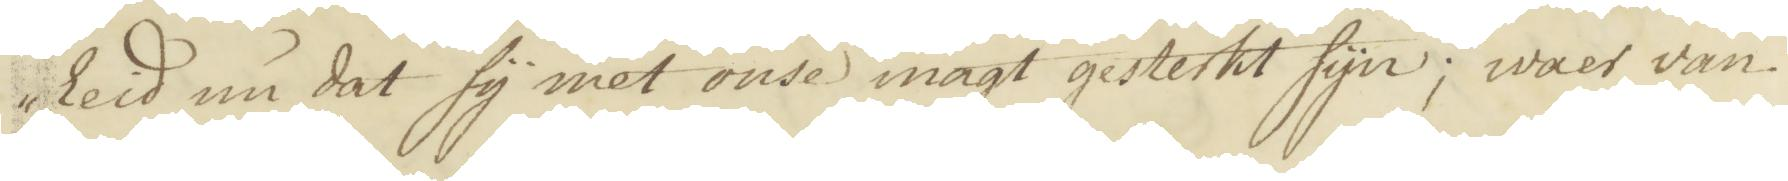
„heid nu dat sij met onse magt gesterkt sijn; waer van
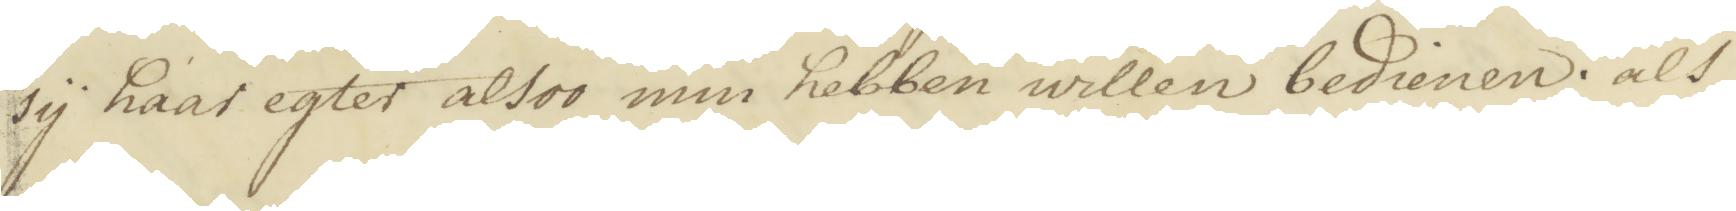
sij haar egter alsoo min hebben willen bedienen; als
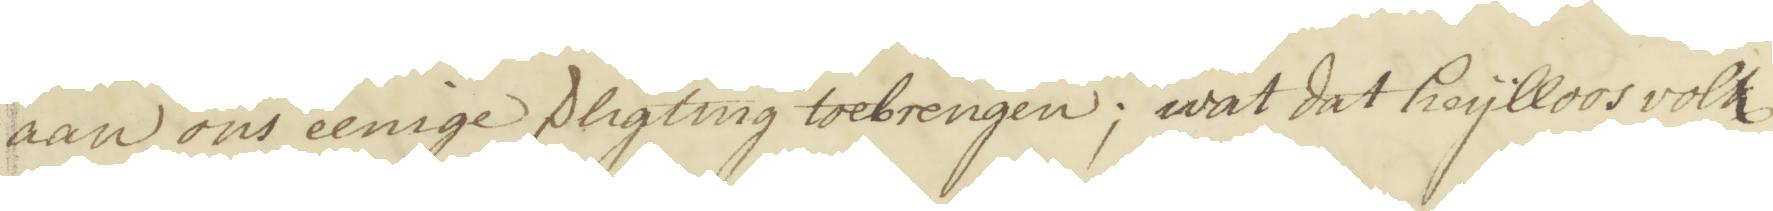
aan ons eenige verligting toebrengen; wat dat heijlloos volk
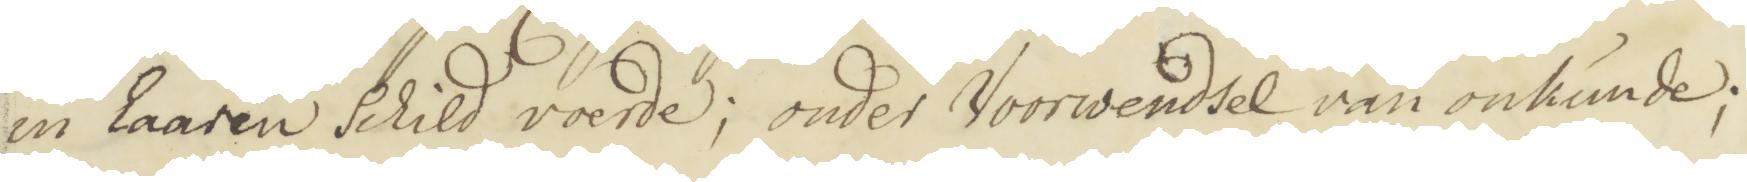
in haaren schild voerde; onder Voorwendsel van onkunde;
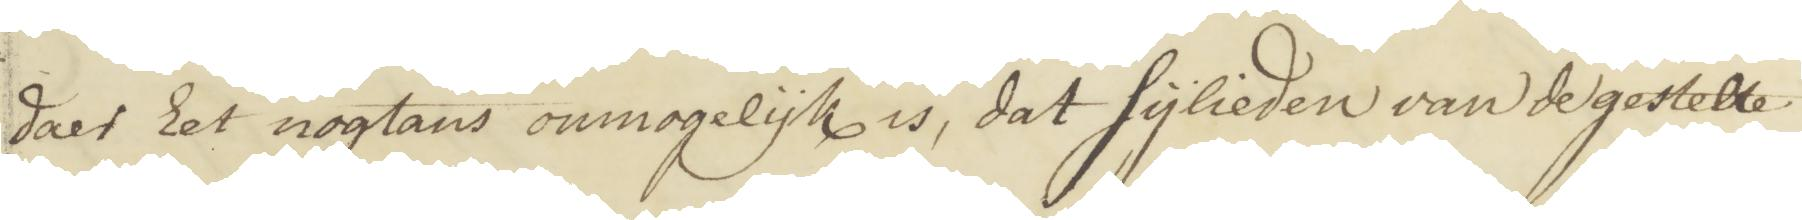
daer het nogtans onmogelijk is, dat sijlieden van de gestelte
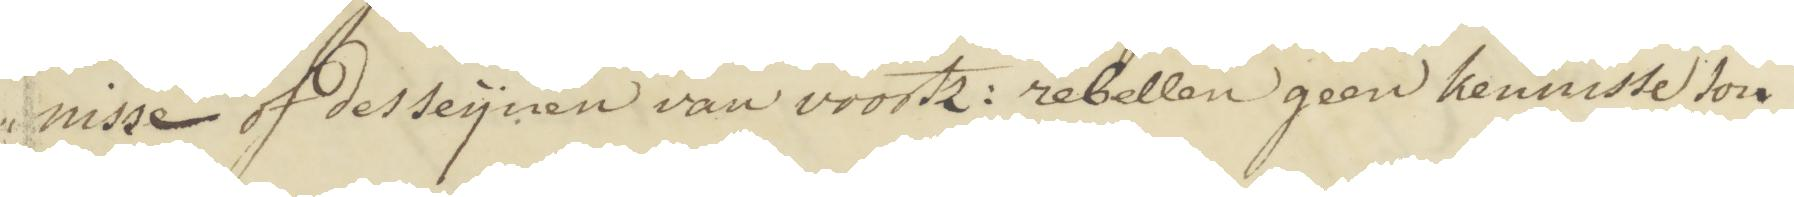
„nisse of desseijnen van voorsz: rebellen geen kennisse sou„
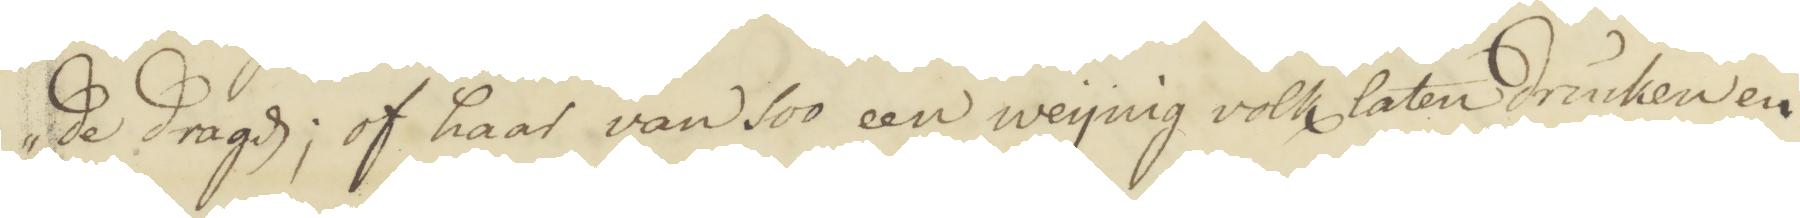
„de dragen; of haar van soo een weijnig volk laten drucken en
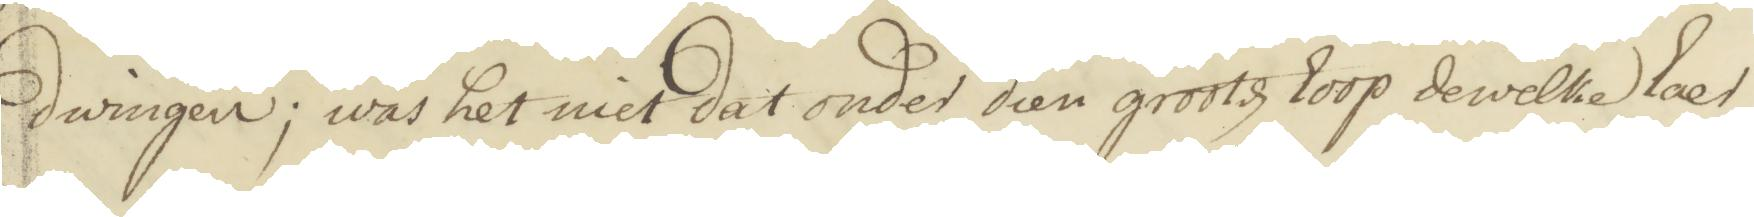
dwingen; was het niet dat onder dien grooten hoop dewelke haer
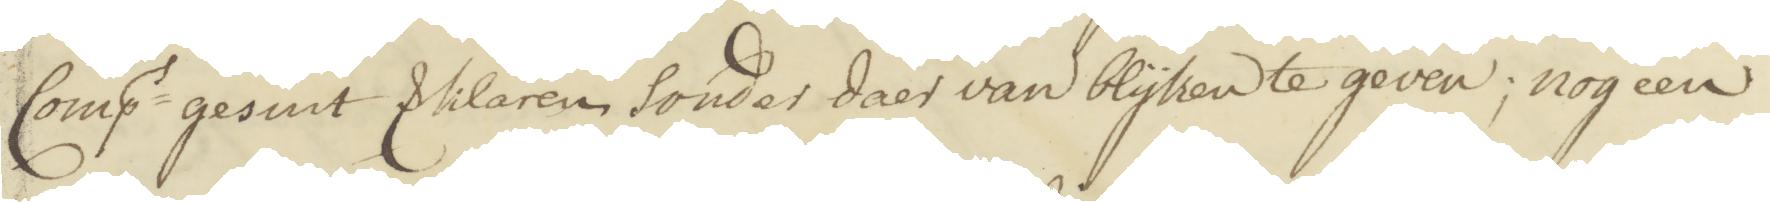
Comp=s gesint verklaren sonder daer van blijken te geven; nog een
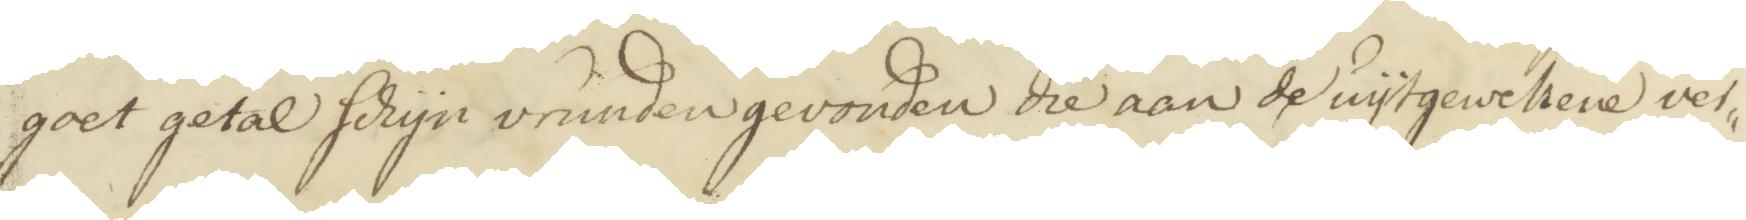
goet getal schijn vrunden gevonden die aan de uijtgewekene ver„
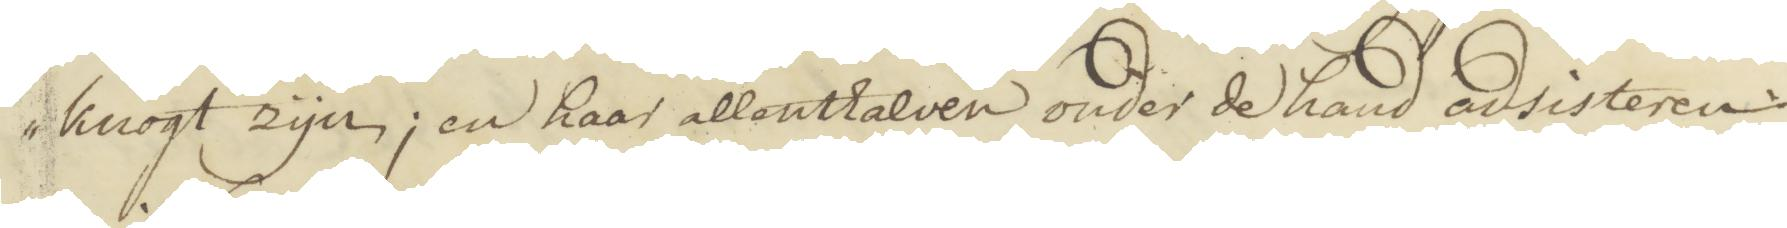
„knogt zijn; en haar allenthalven onder de hand adsisteren;
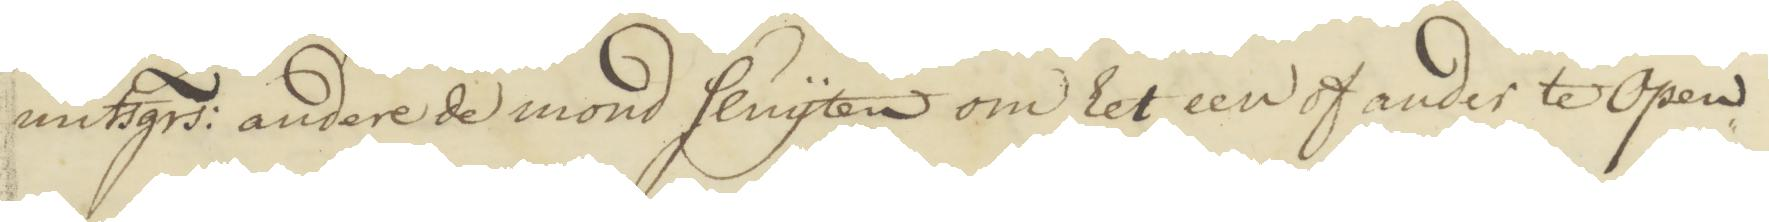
mitsgrs: andere de mond sluijten om het een of ander te Open„
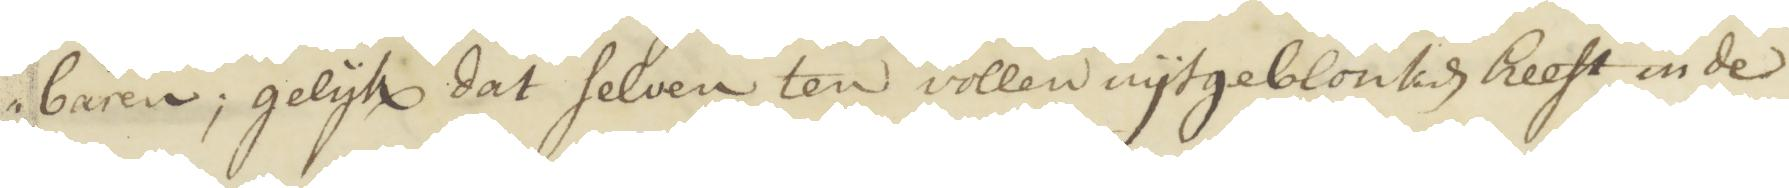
„baren; gelijk dat selven ten vollen uijtgeblonken heeft in de
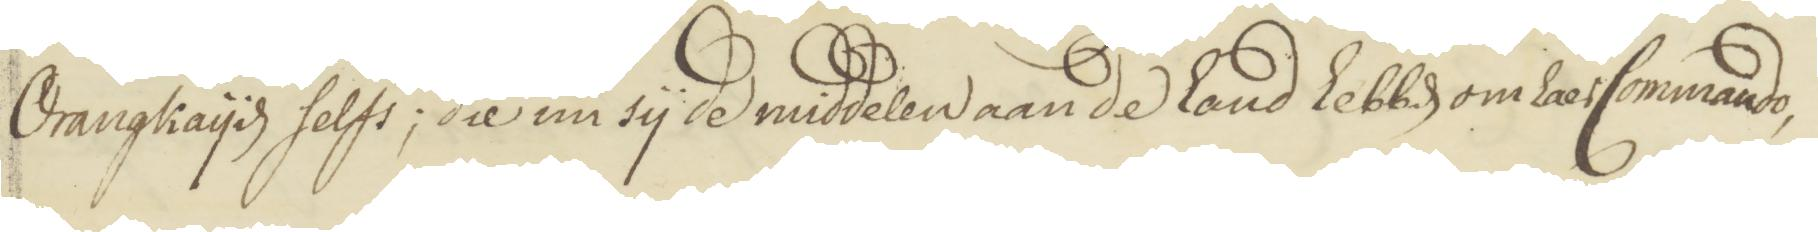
Orangkaijen selfs; die nu sij de middelen aan de hand hebben om haer Commando,
